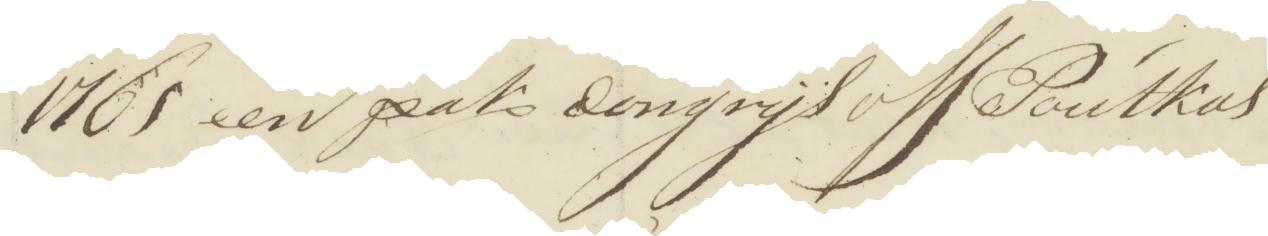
1765 een pak dongrijs off Poutkas
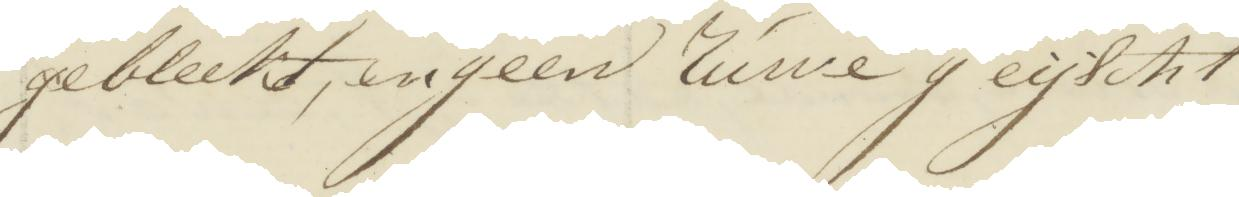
gebleekt, en geen ruwe g’ eijscht
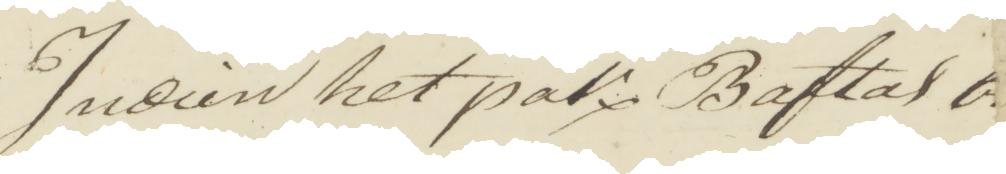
Jndien het pak Baftas b
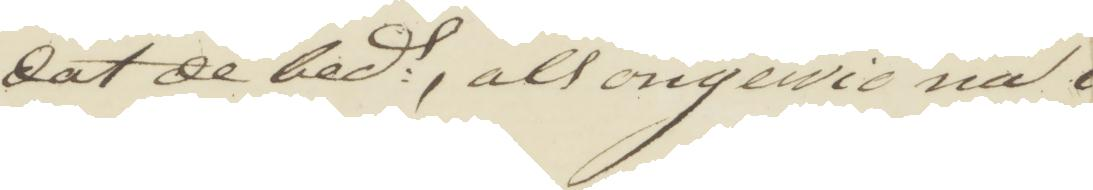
dat de bed:s, als ongewil na
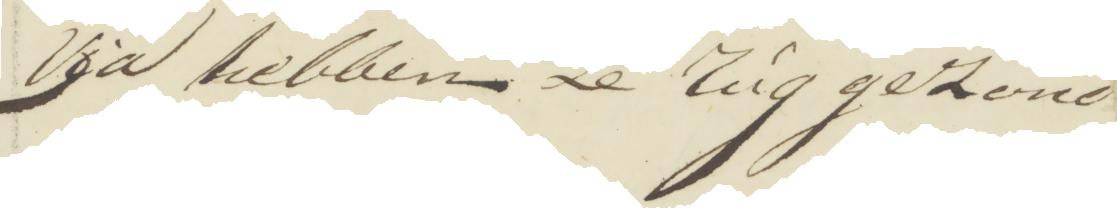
via hebben te rug gezond
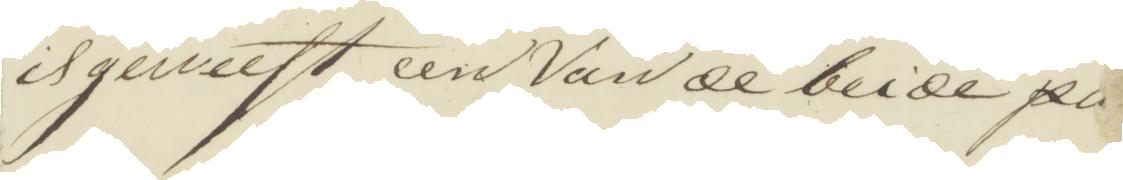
is geweest een van de beide pa
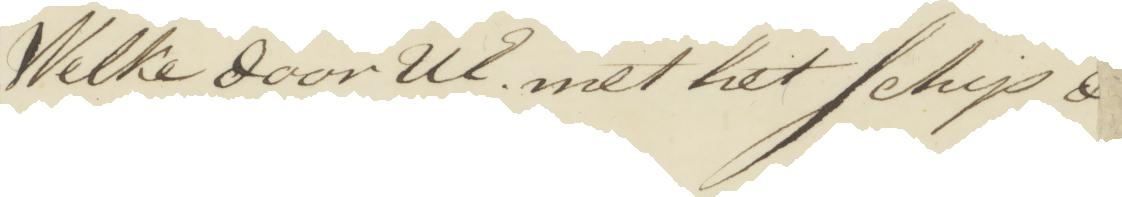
Welke door UE. met het schip
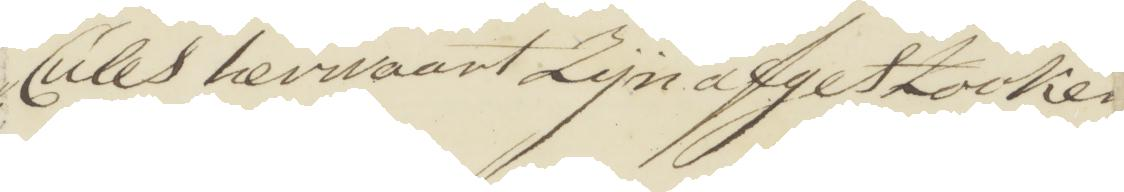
„Cules herwaart zijn afgestooke
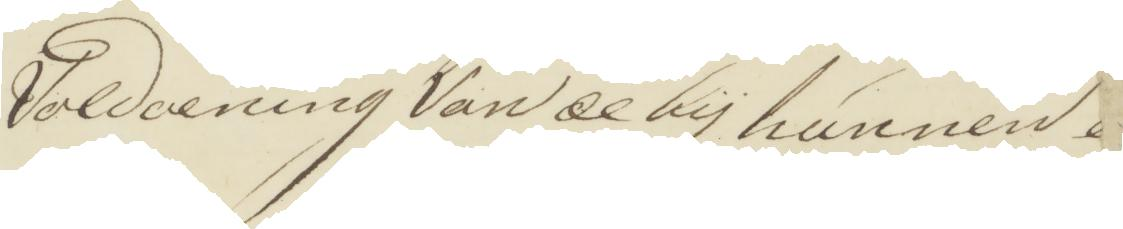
voldoening van de bij kunnen
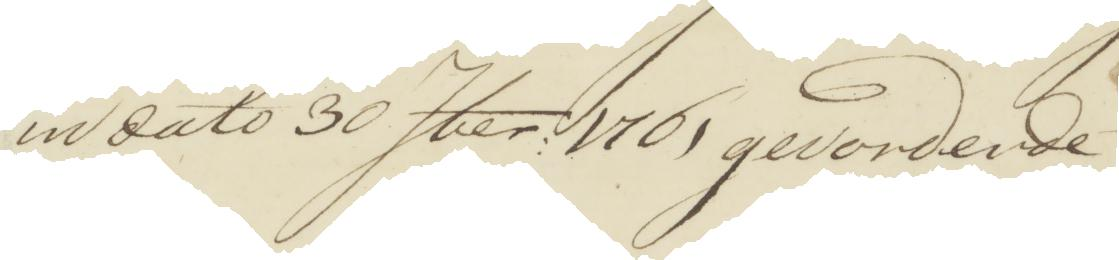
in dato 30 7ber: 1761 gevorderde
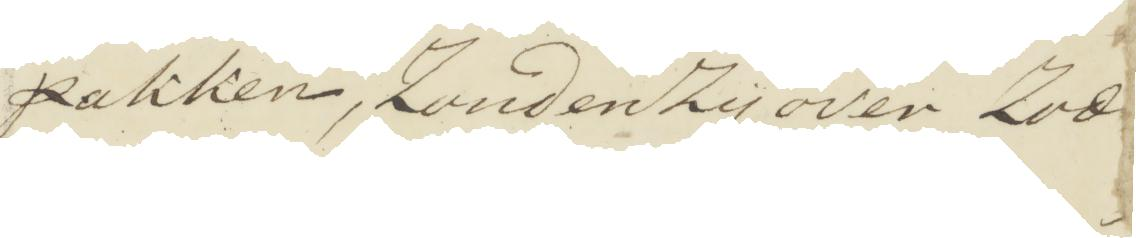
pakken, zouden zij over zod
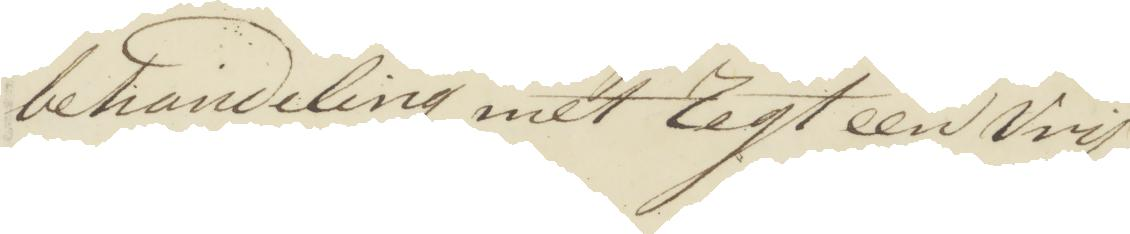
behandeling met regt een vrij
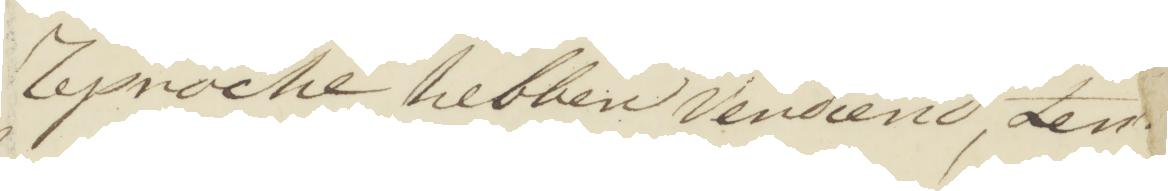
reproche hebben verdiend, ten
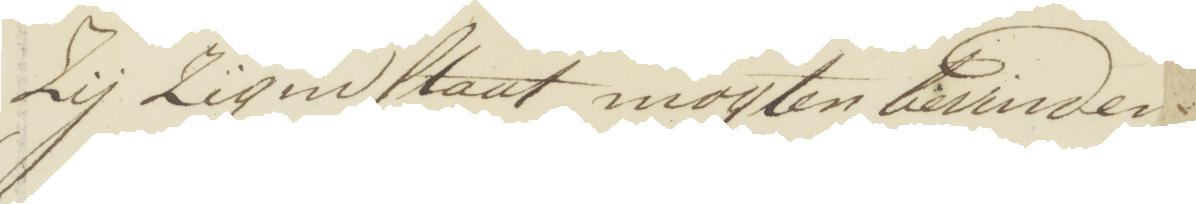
zij zig in staat mogten bevinden
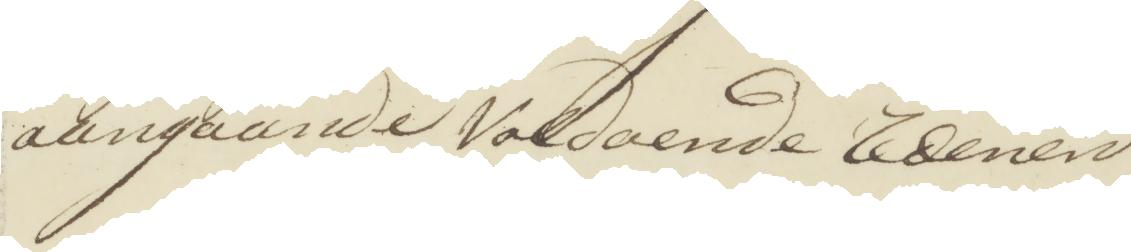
aangaande voldoende redenen
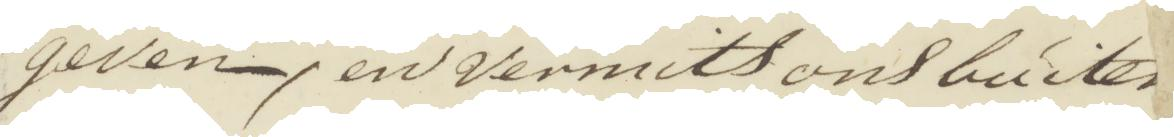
geven, en vermits ons buiten
